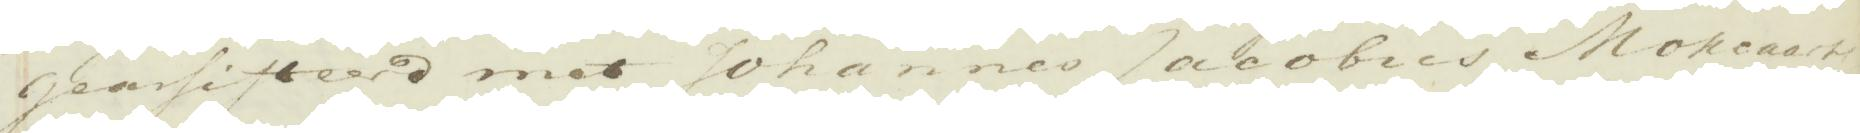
geassisteerd met Johannes Jacobus Mokcaart
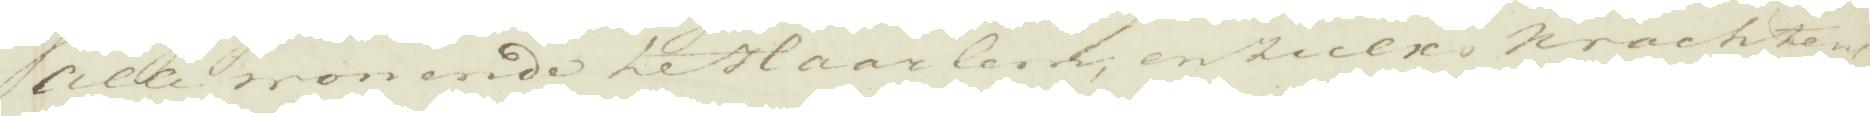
alle wonende te Haarlem, en zulxs krachtens
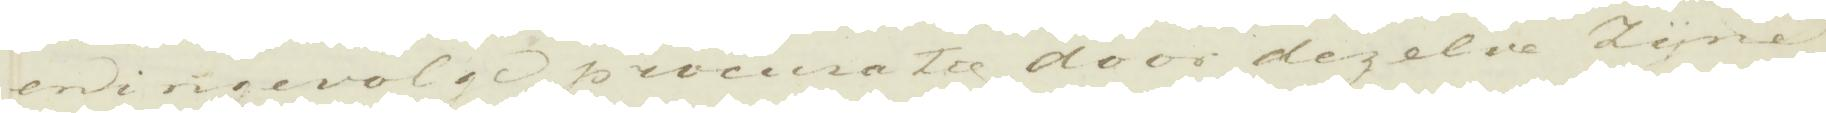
en ingevolge procuratie door dezelve zijne
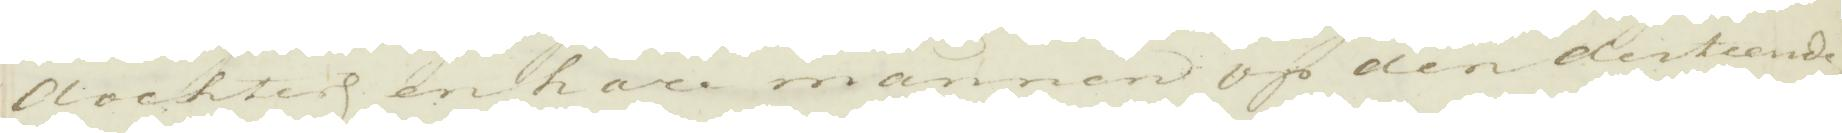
dochters en hare mannen op den dertienden
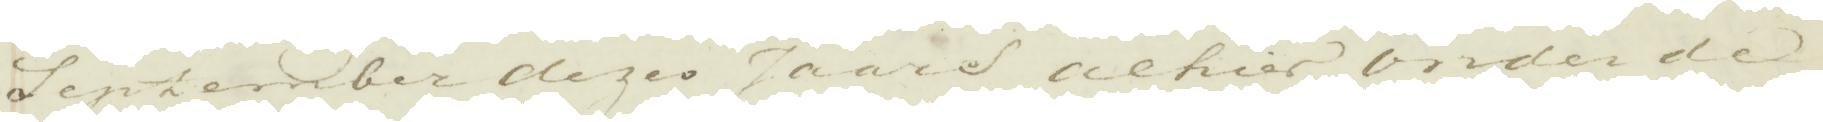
September dezes Jaars alhier onder de
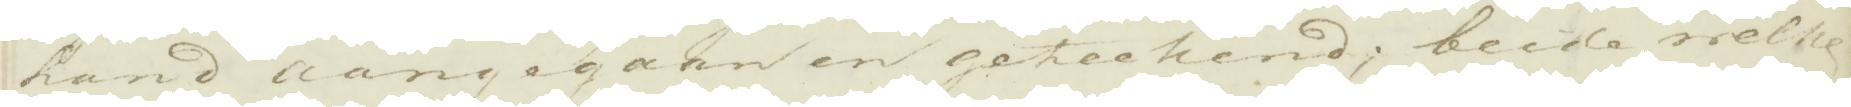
hand aangegaan en geteekend, beide welke
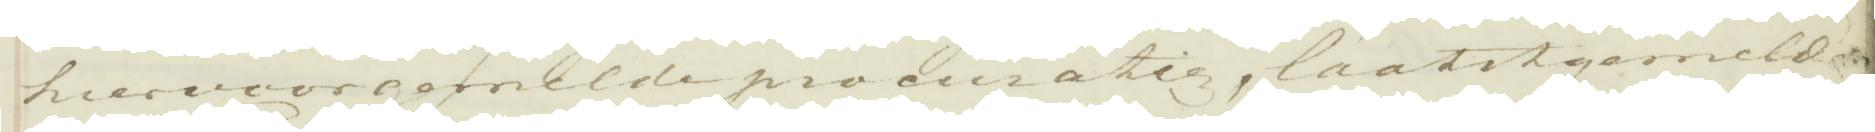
hiervoor gemelde procuratien, laatst gemelde
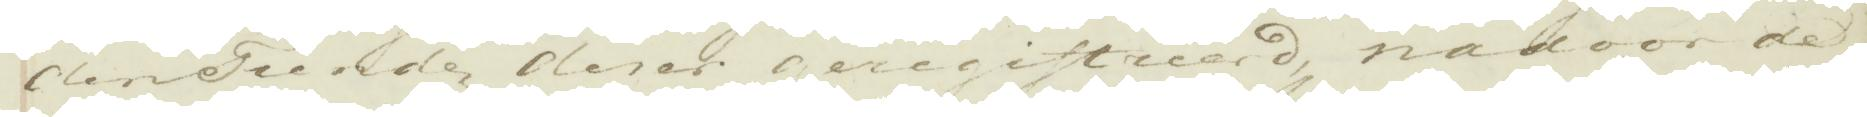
den Tienden deser geregistreerd, na door de
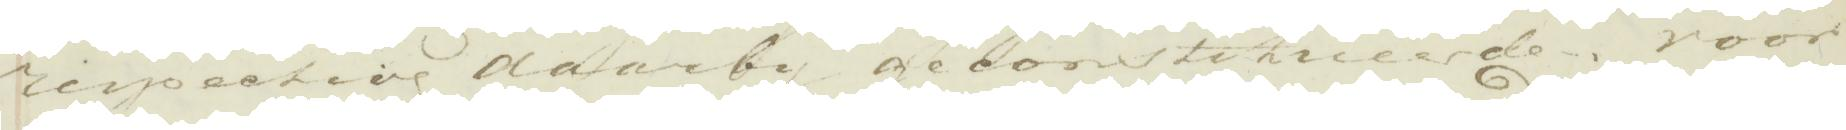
respective daarby geconstitueerden voor
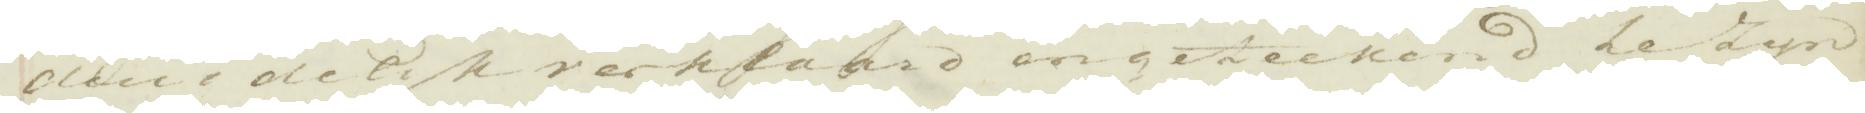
deugdelyk verklaard en geteekend te zyn
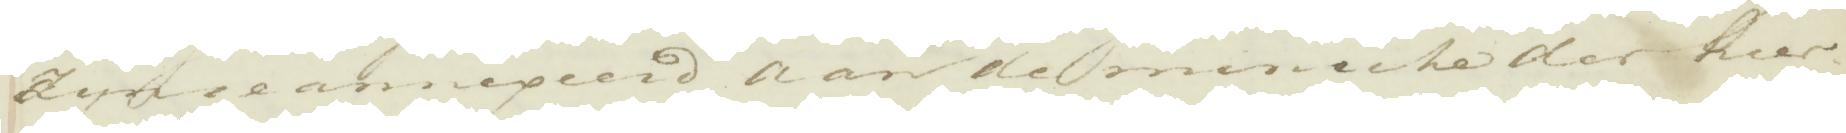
Zyn geannexeerd aan de minute der hier
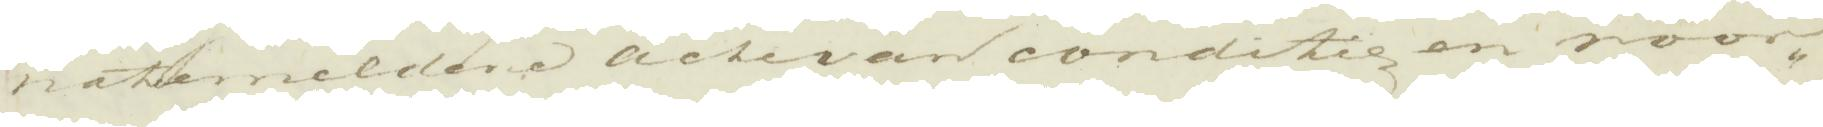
natemeldene acte van conditien en voor„
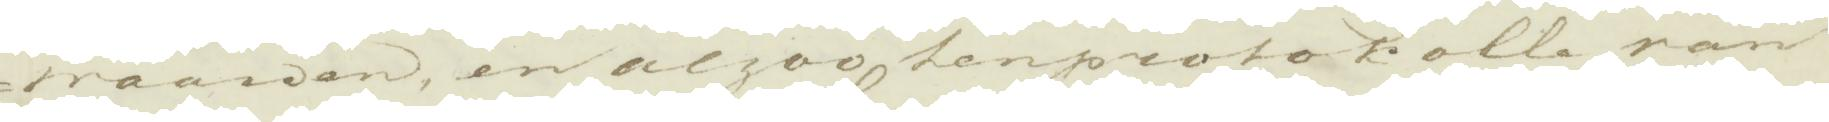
waarden, en alzoo ten protokolle van
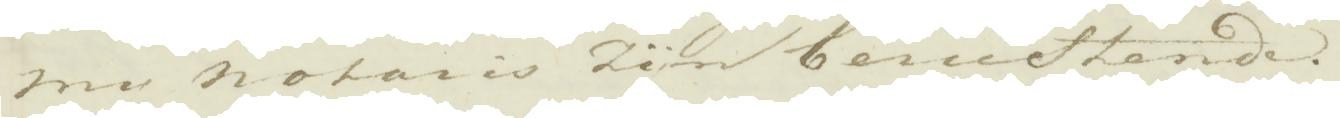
my notaris zijn berustende.
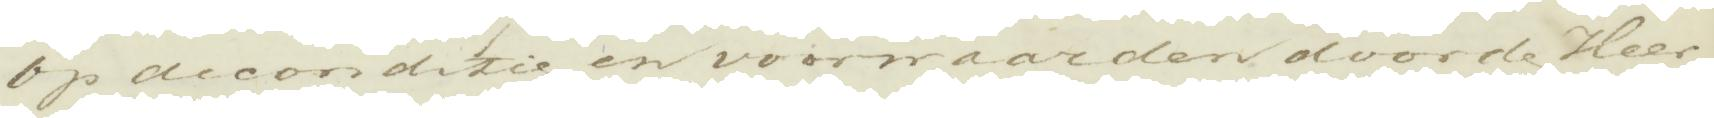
Op de conditien en voorwaarden door de Heer
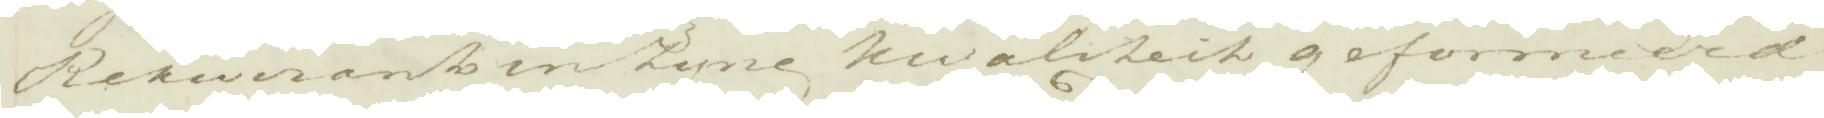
Rekurrant in Zyne kwaliteit geformeerd
